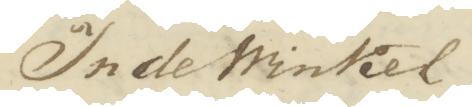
In de Winkel
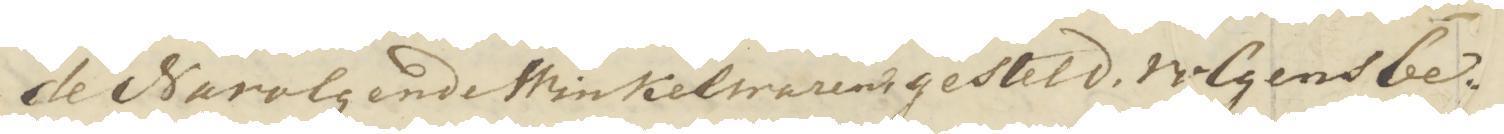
de Navolgende Winkelwaren, gesteld, volgens be„
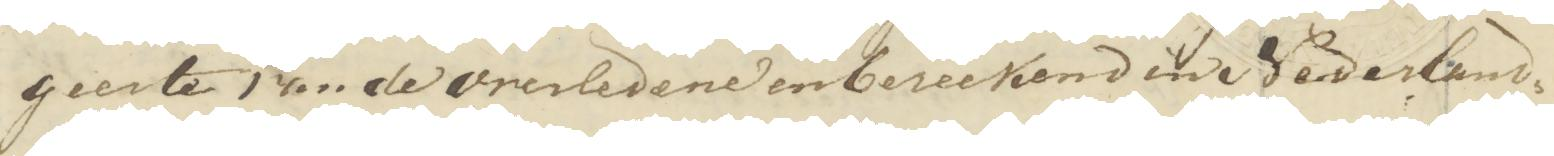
geerte van de overledene en bereekend in Nederland
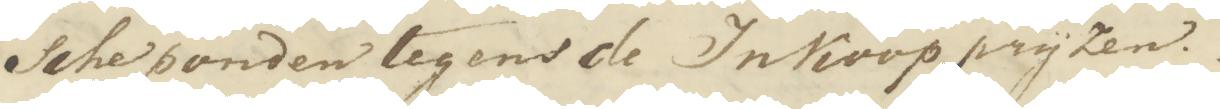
sche ponden tegens de Inkoop prijzen.
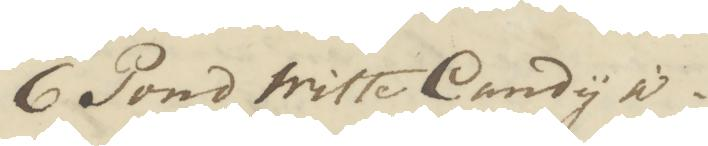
6 Pond witte Candij à
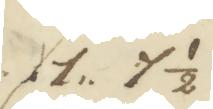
ƒ1„7½
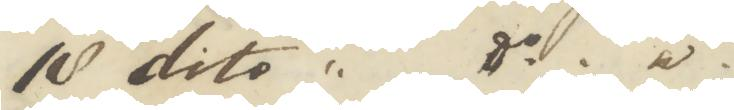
18 dito „ d.o . à
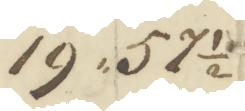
19„57½
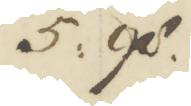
5„ 98.
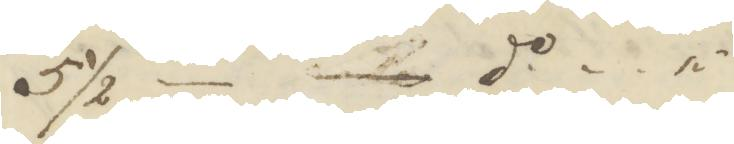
5½ — — d.o - . à
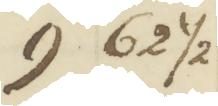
9 62½
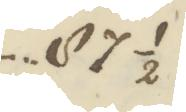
„87½
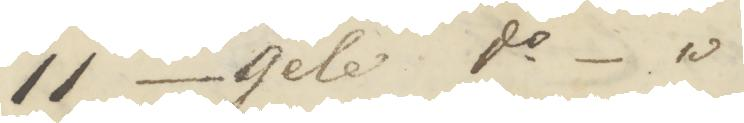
11 —gele d.o — a
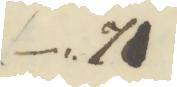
—.71
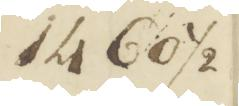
1460½
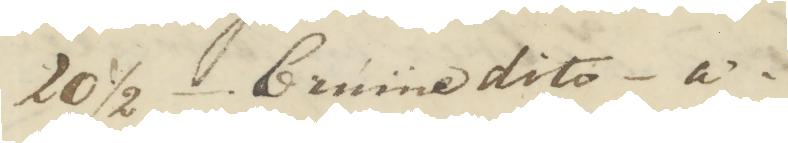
20½ bruine dito - a
